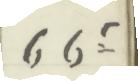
66=5
